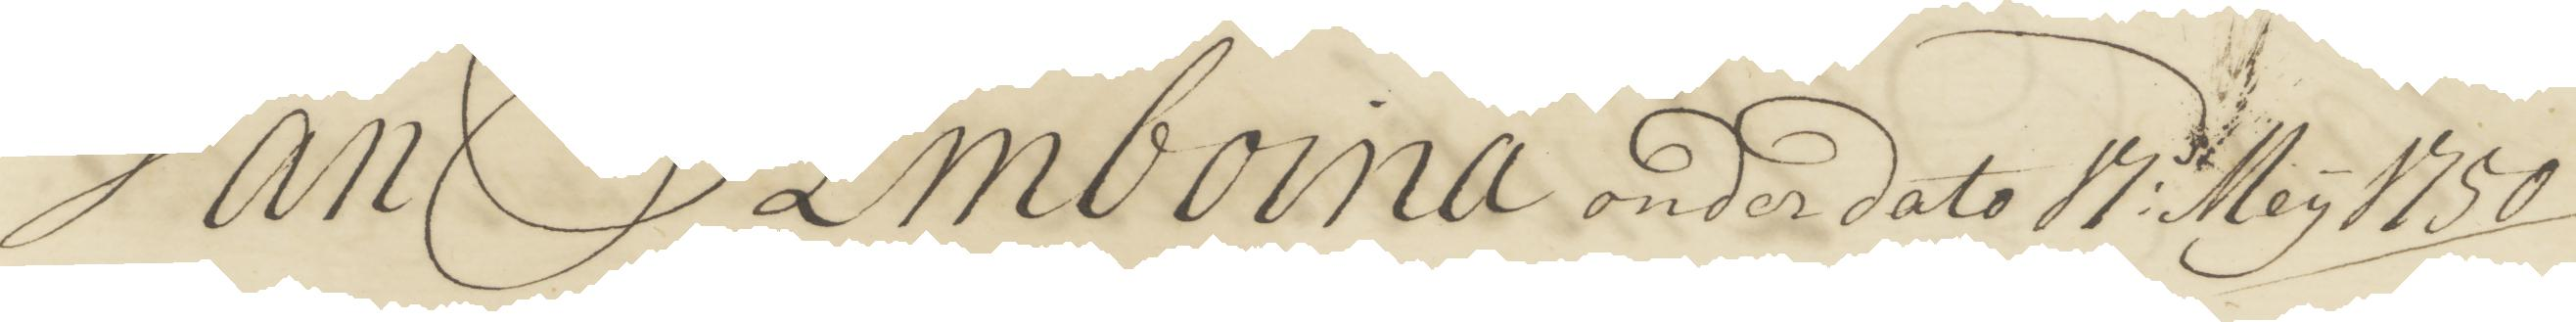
Van Amboina onder dato 17:e Meij 1750.
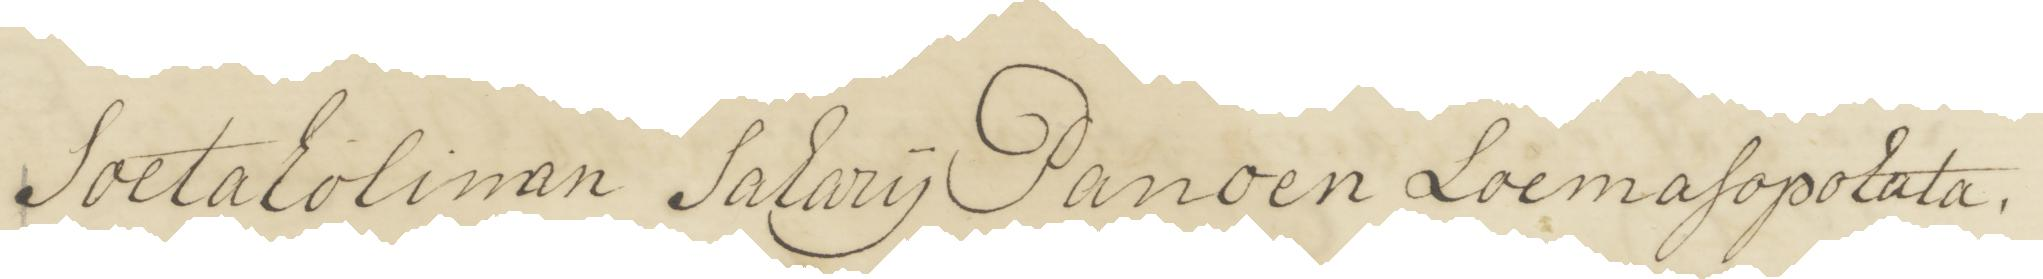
Soetaholiman Saharij Panoen Loemasopohata,
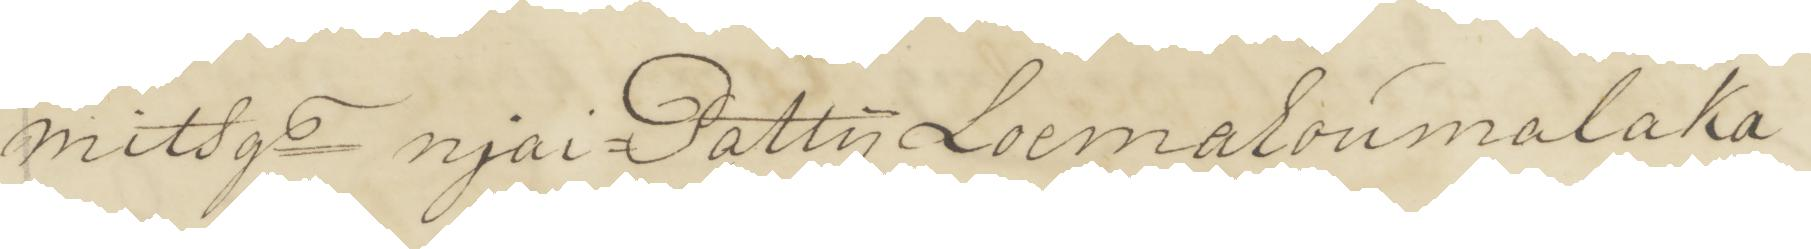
mitsg=s njai = Pattij Loemahoumalaka
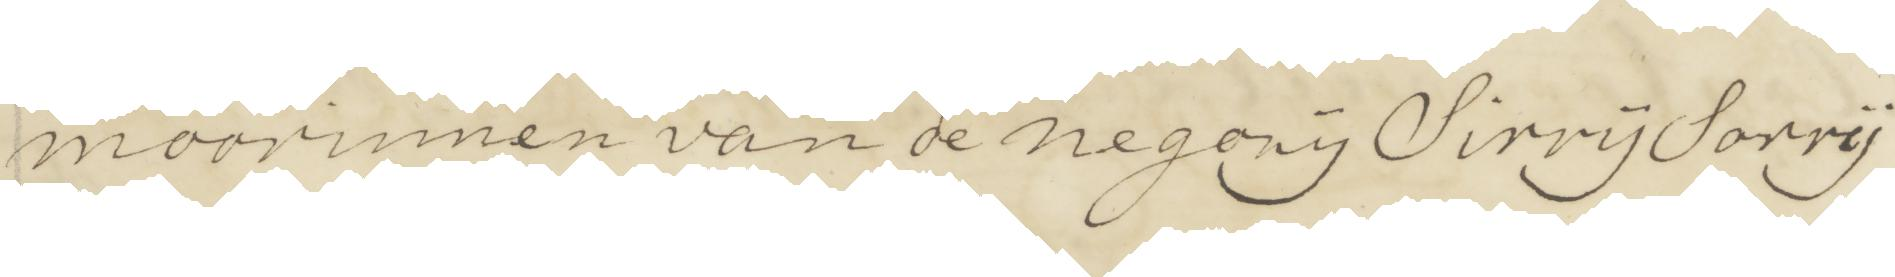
moorinnen van de negorij Sirrij Sorrij
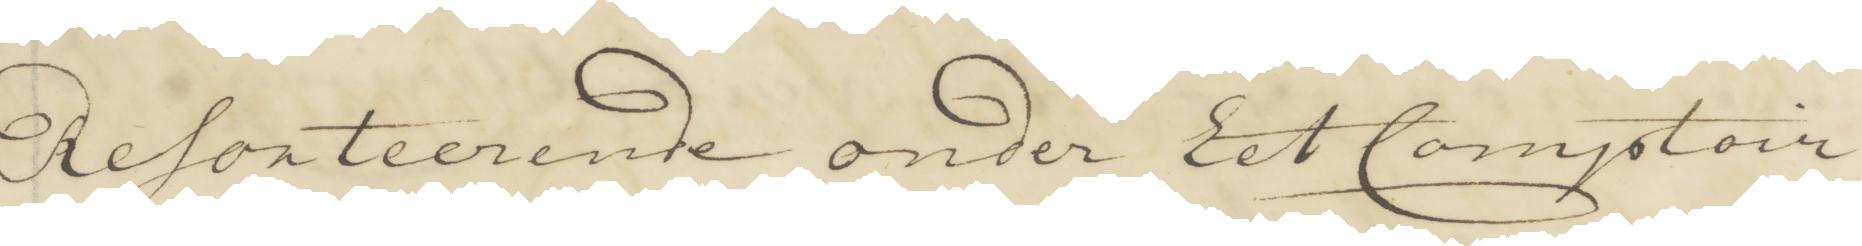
Resorteerende onder het Comptoir
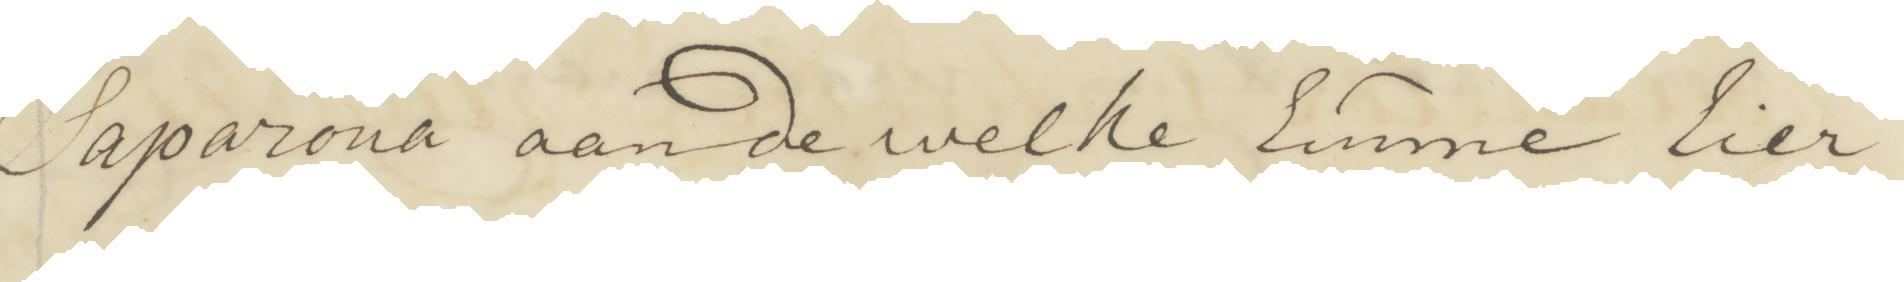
Saparoua aan de welke hunne hier
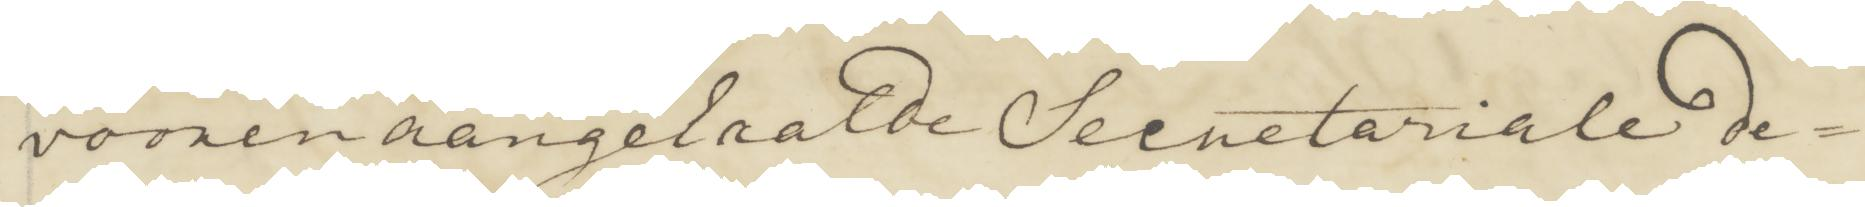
vooren aangehaalde Secretariale de=
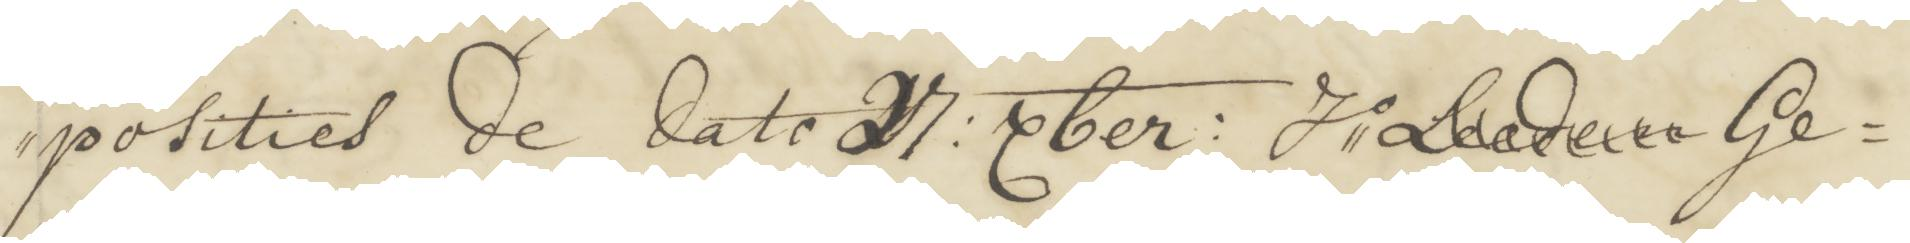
„posities de dato 27: xber: J„o Leeden Ge=
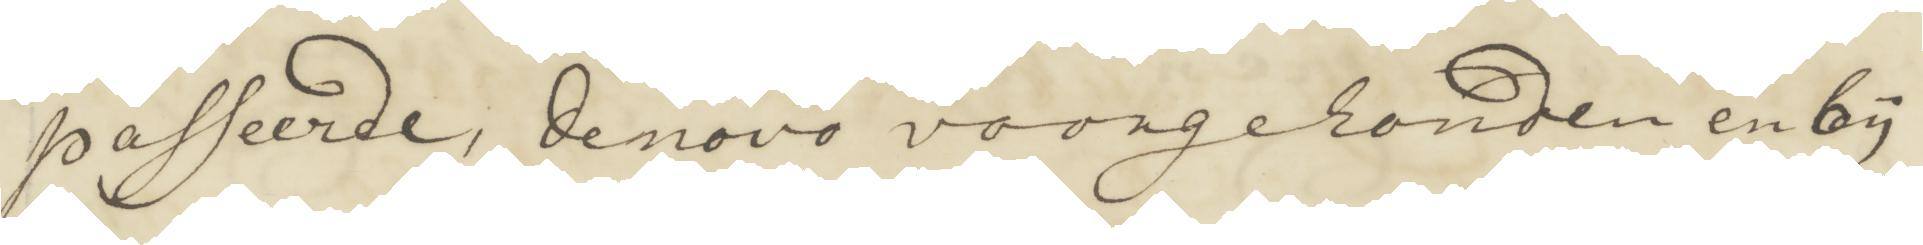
passeerde, de novo voorgehouden en bij
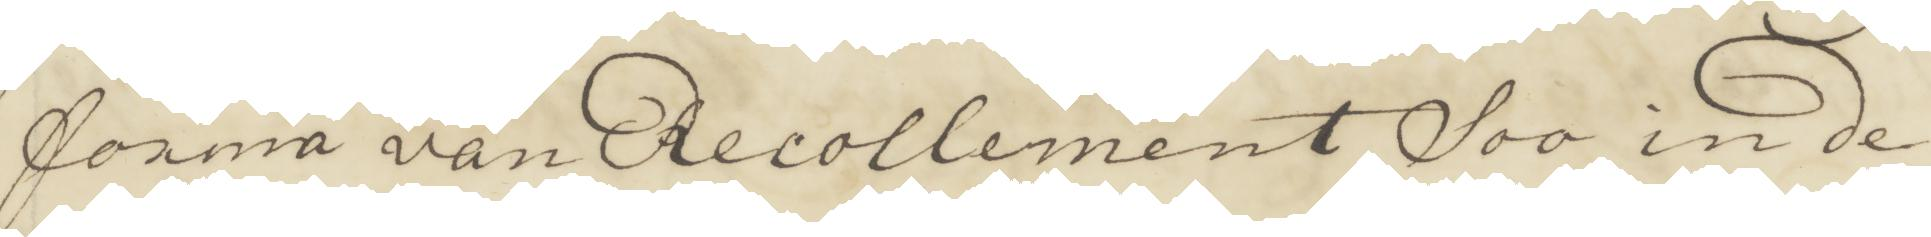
forma van Recollement Soo in de
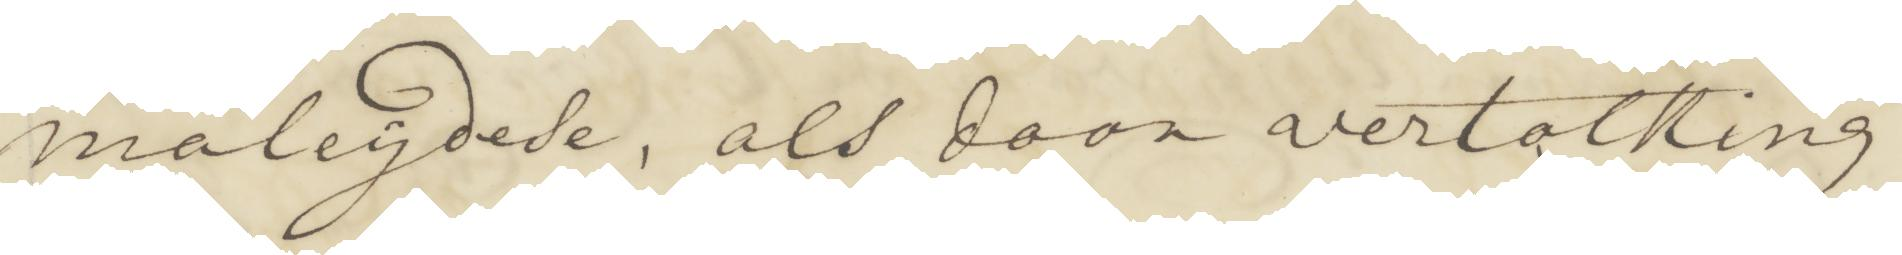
maleijdese, als door vertolking
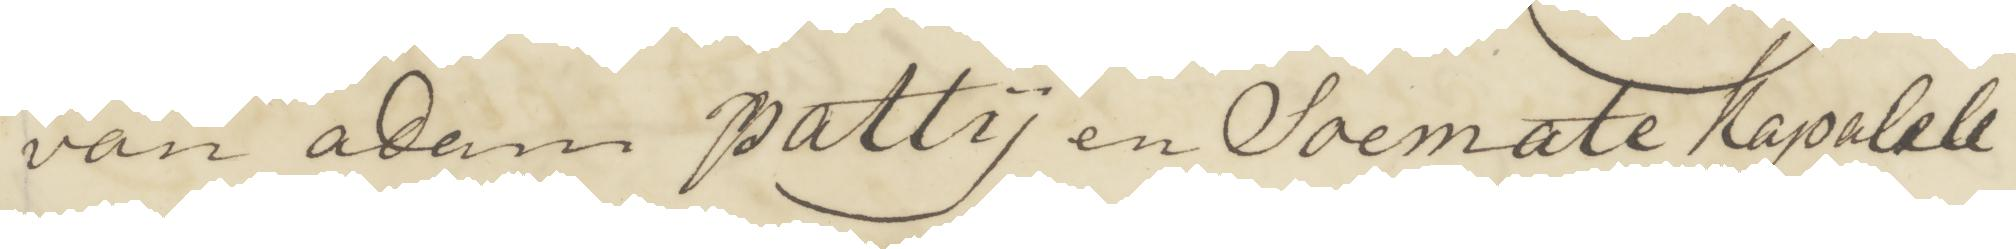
van adam pattij en Soemate Kapalele
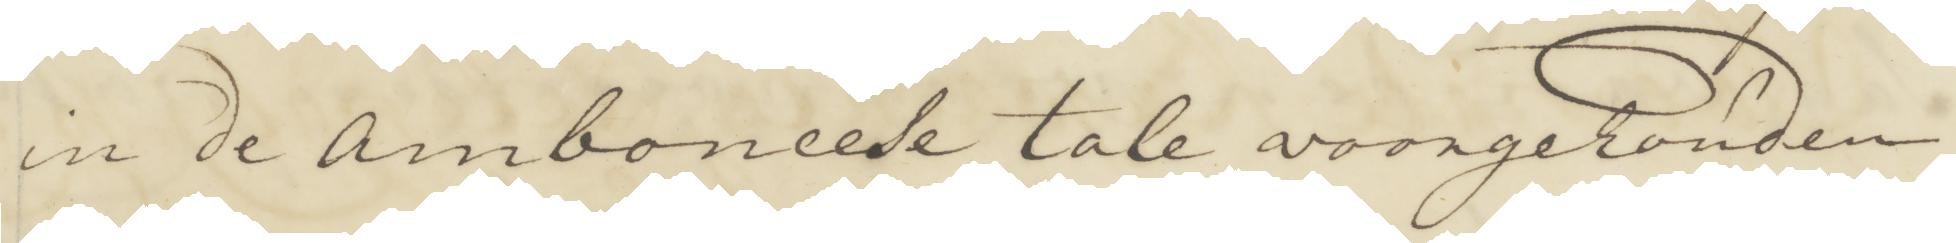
in de Amboneese tale voorgehouden
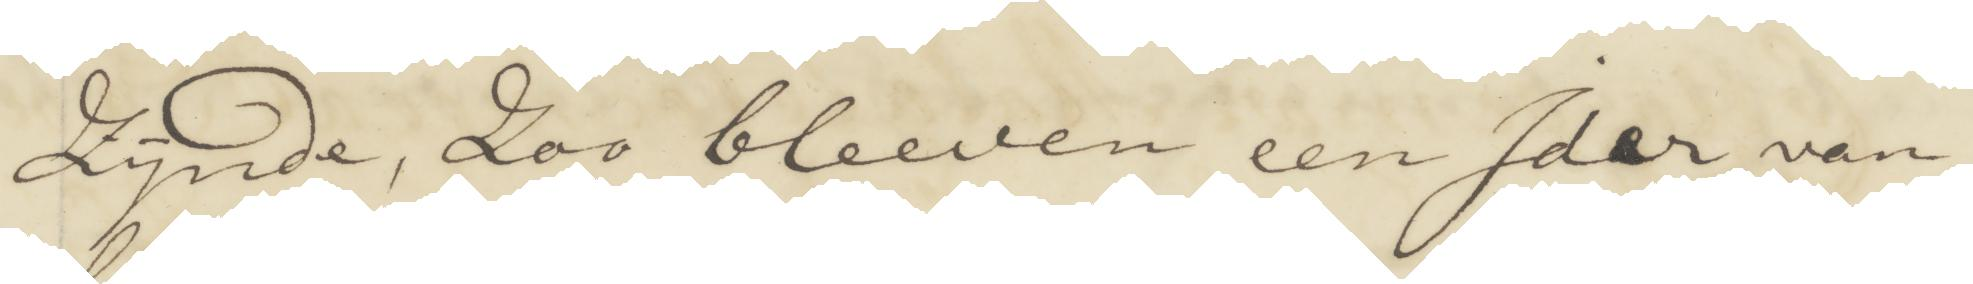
Zijnde, Zoo bleeven een Jder van
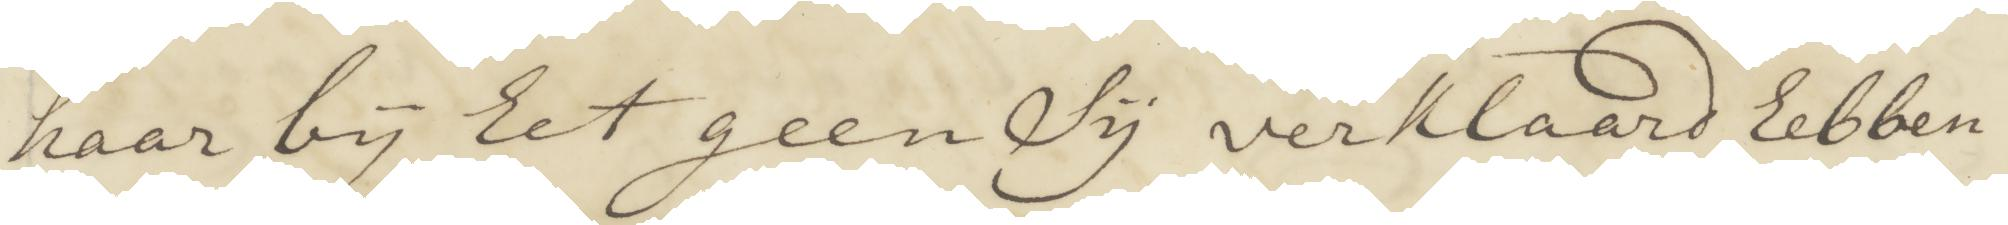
haar bij het geen Sij verklaard hebben
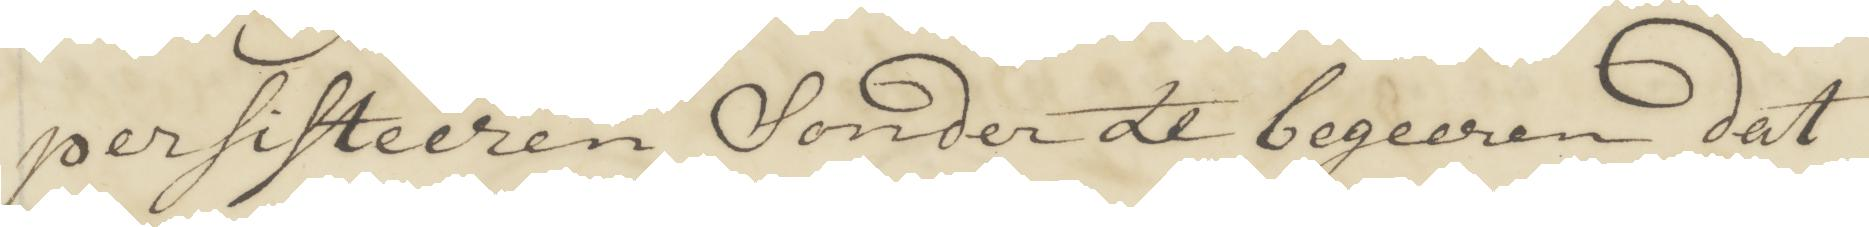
persisteeren Sonder te begeeren dat
